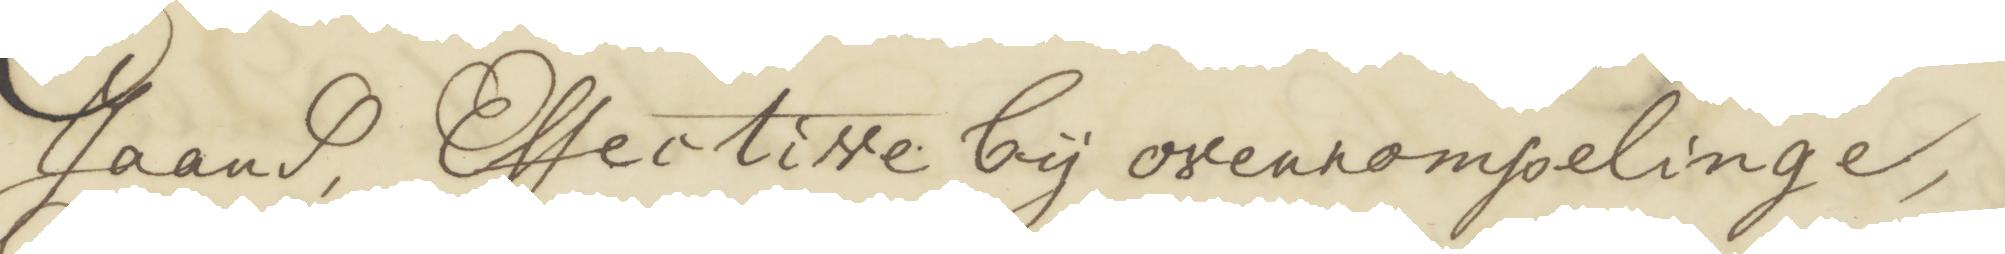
Jaars, Effective bij overrompelinge,
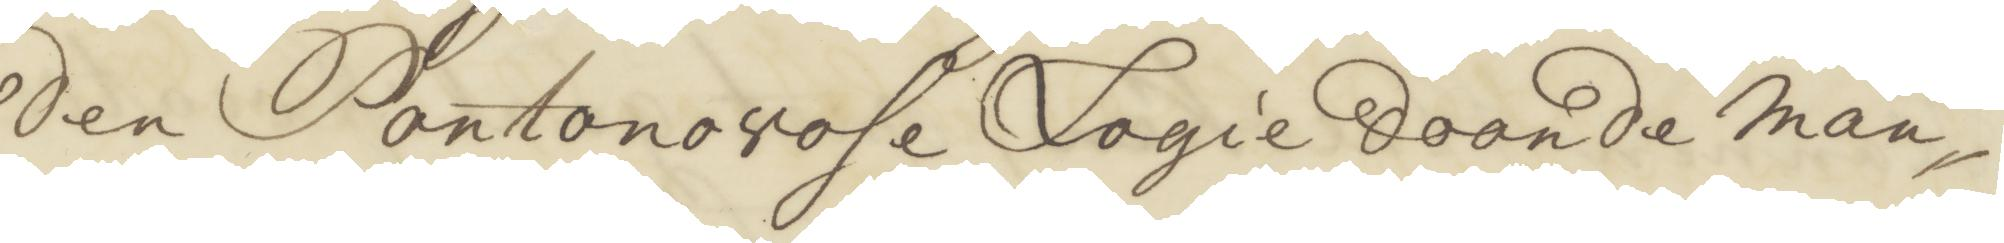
den Portonovose logie door de mar„
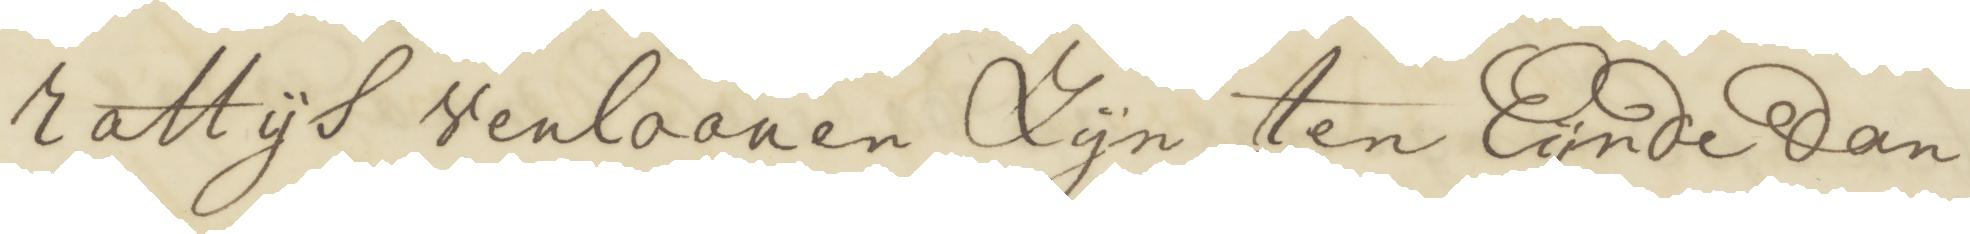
rattijs verlooren zijn ten Eijnde dan
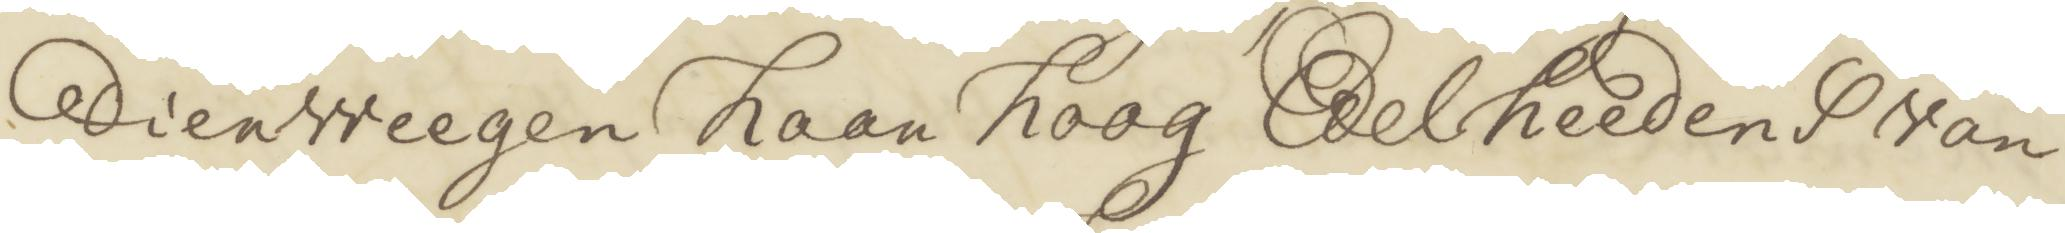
dierweegen haar hoog Edelheedens van
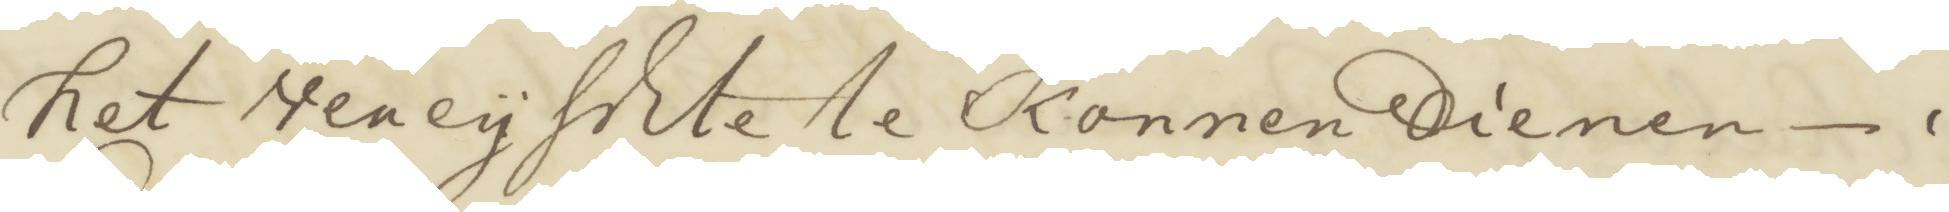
het vereijschte te konnen dienen — ,
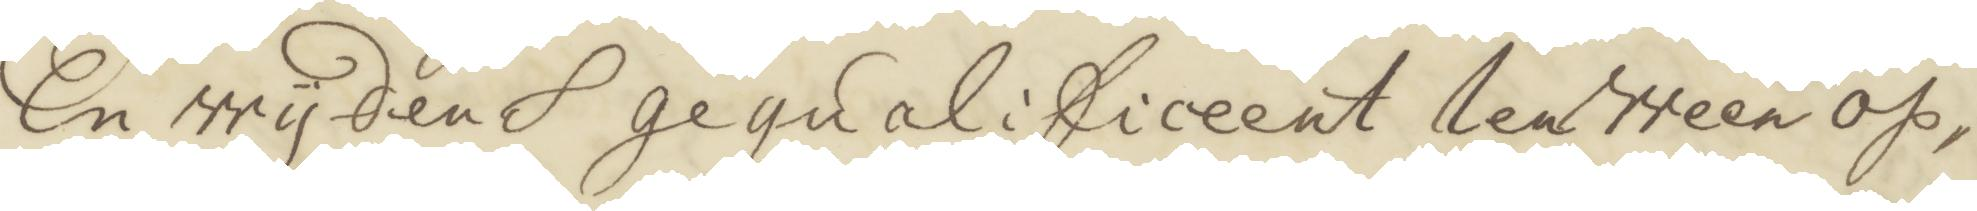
En wijders gequalificeert ter weer op„
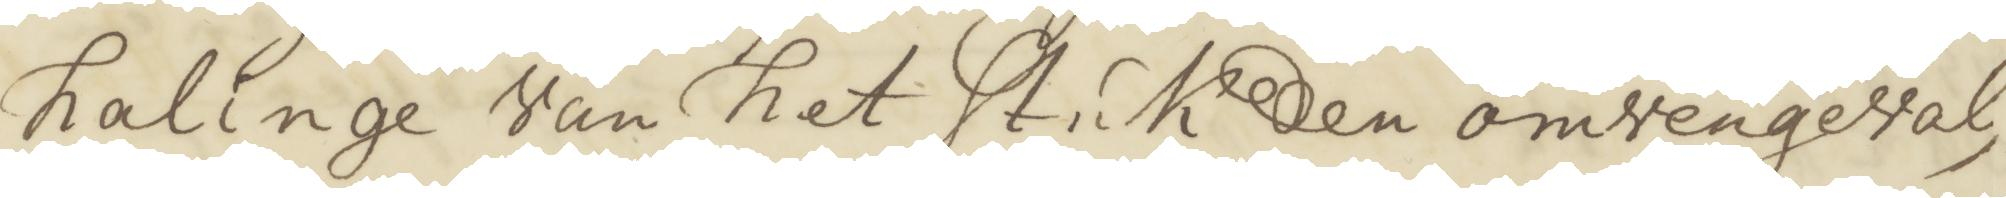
halinge van het stuk den omvergeval„
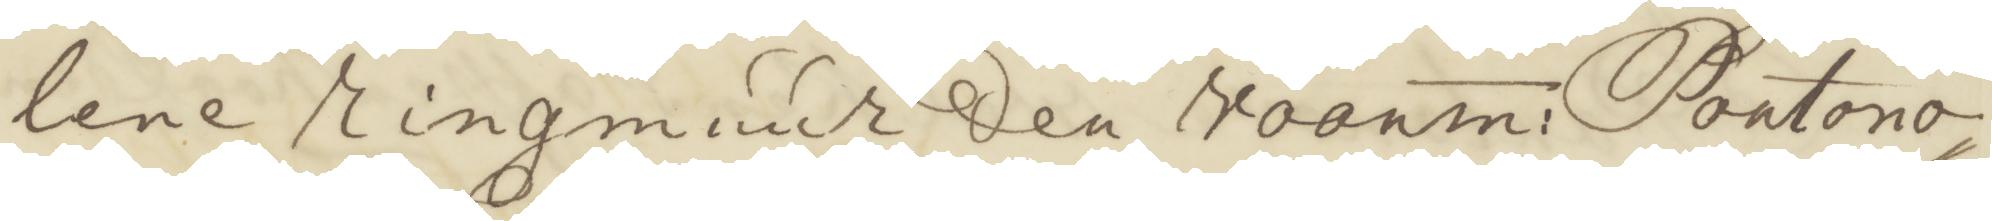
lene ringmuur den voorm: Portono„
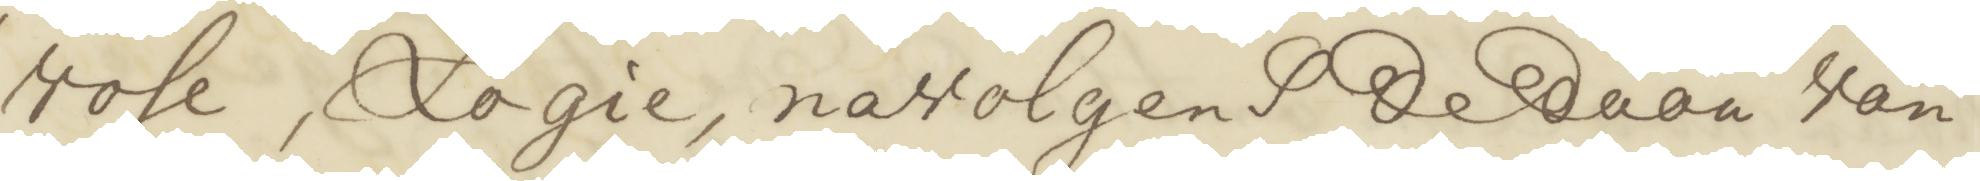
vose, Logie, navolgens de daar van
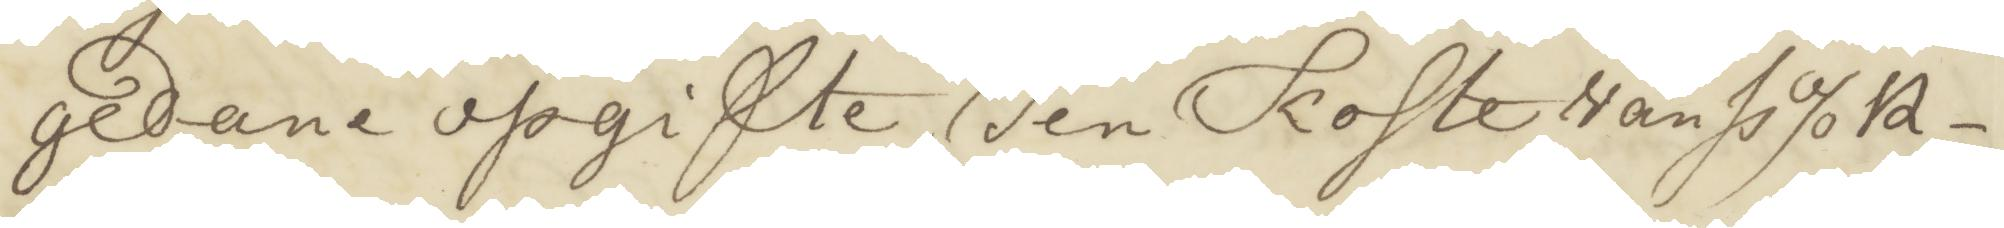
gedane opgifte, Ten koste van p a/o 12 —
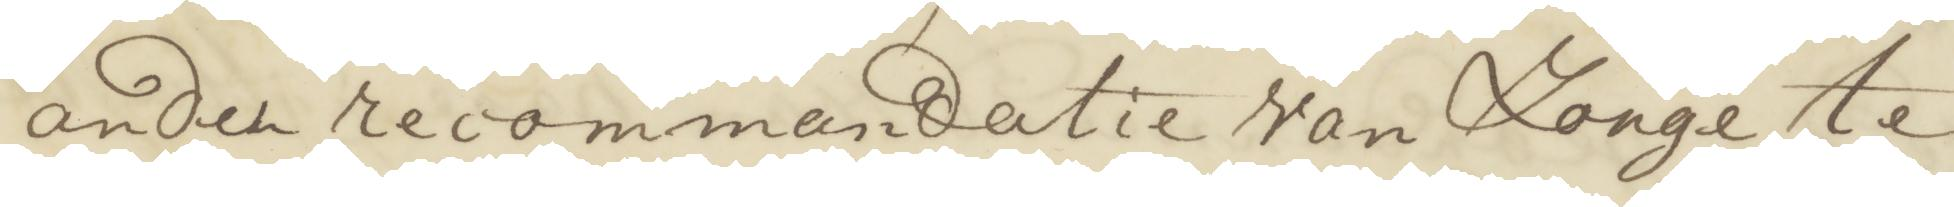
onder recommandatie van zorge te
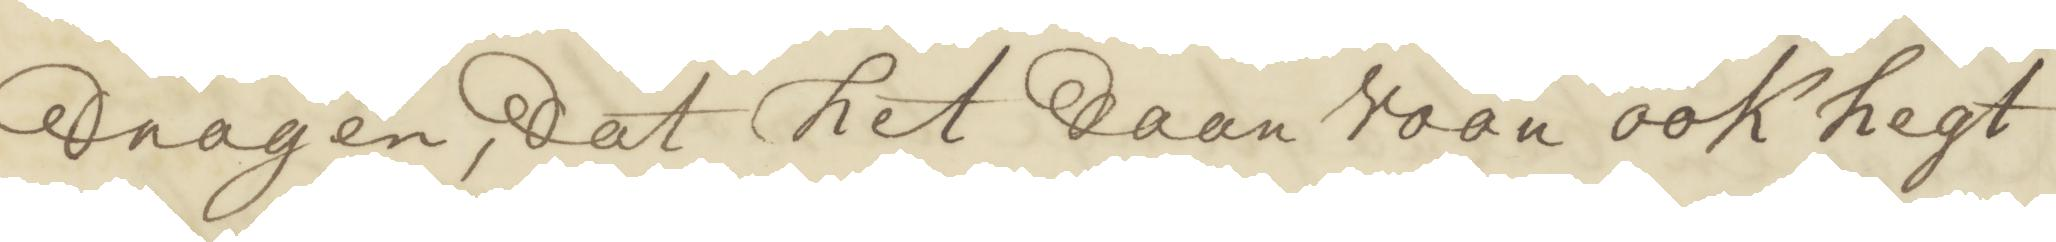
dragen, dat het daar voor ook hegt
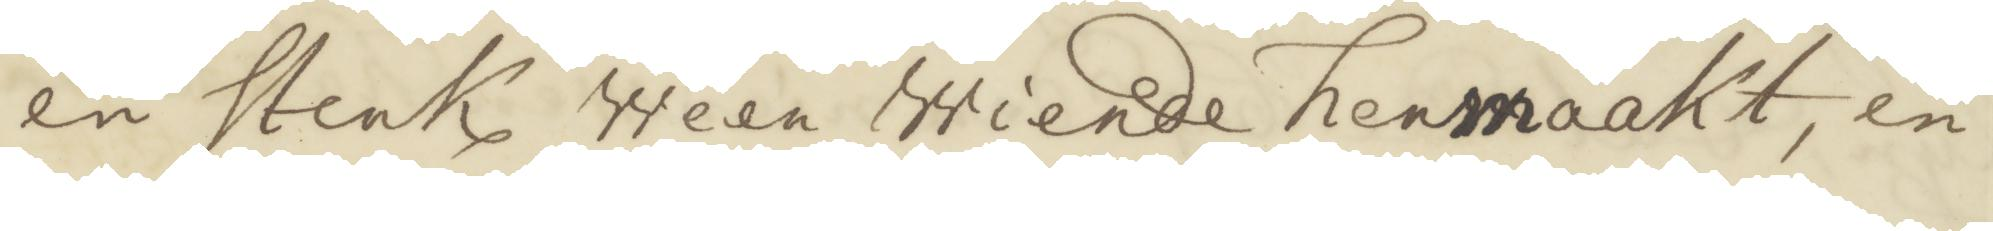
en sterk weer wierde herwaakt, en
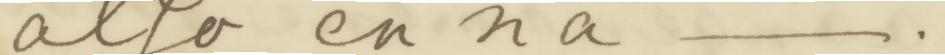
also 'er na — .
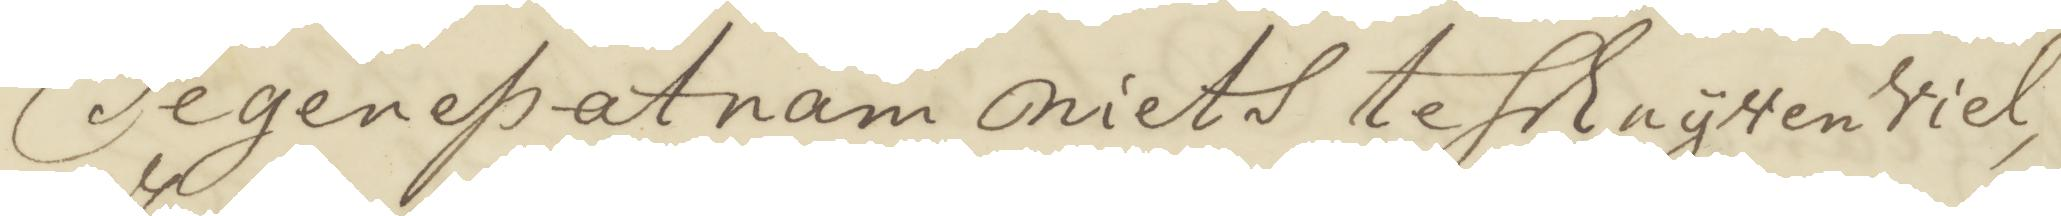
Tegenepatnam niets te schrijven viel,
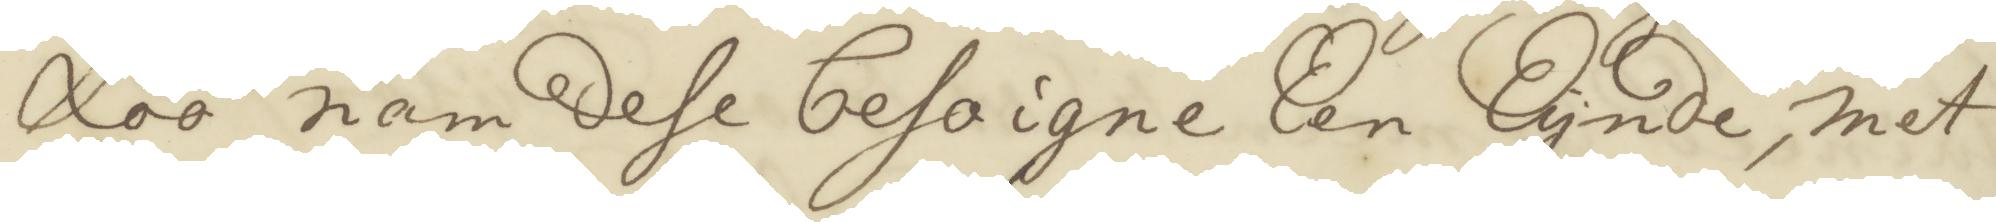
zoo nam dese besoigne Een Eijnde, met
